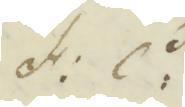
F: C:o
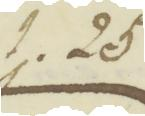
1. 23
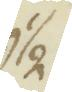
½
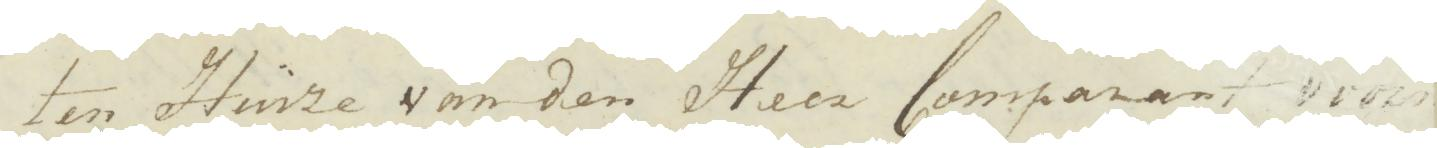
ten Huize van den Heer Comparant voor
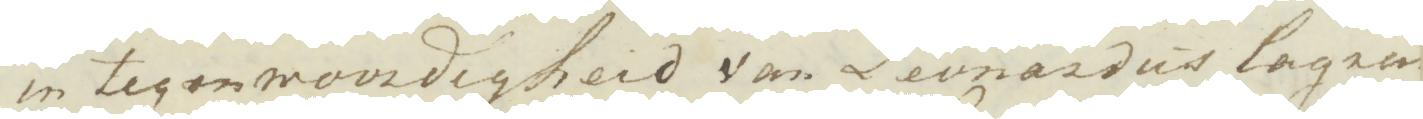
in tegenwoordigheid van Leonardus lagra
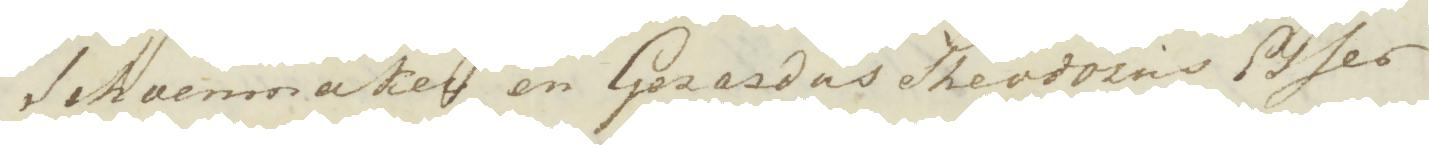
schoenmaker en Gerardus Theodorus Esser
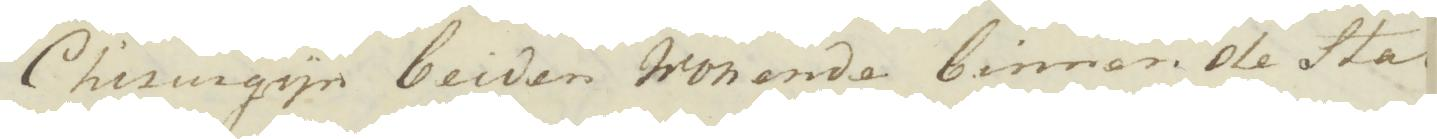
Chirurgijn beiden wonende binnen de sta
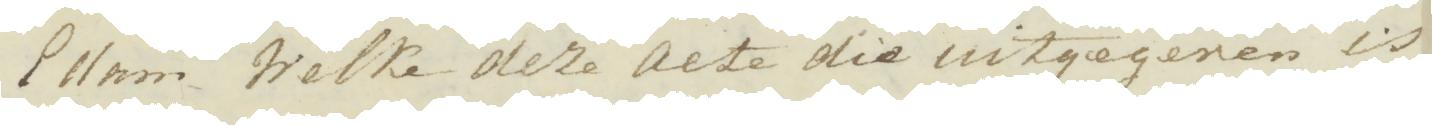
Edam welke deze acte die uitgegeven is
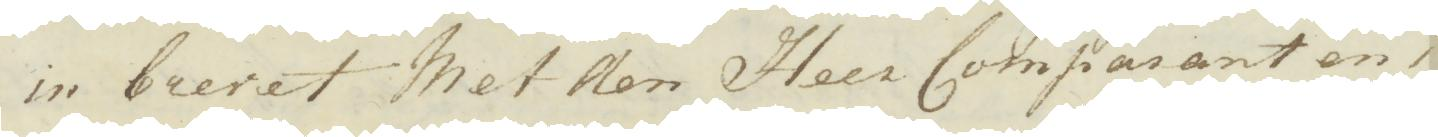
in brevet met den Heer Comparant en
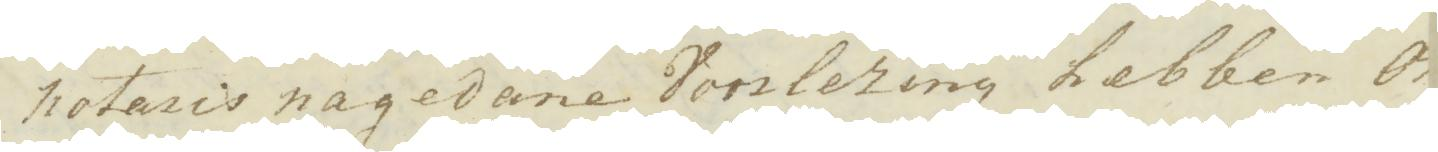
notaris na gedane voorlezing hebben O
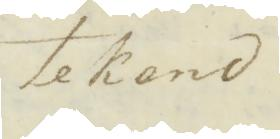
tekend
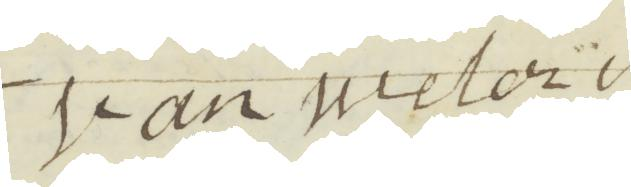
Van weteri
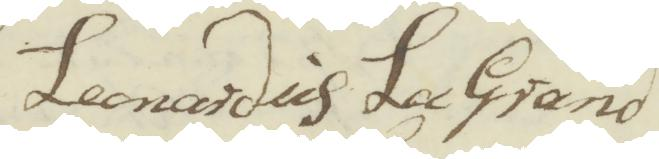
Leonardus La Grand
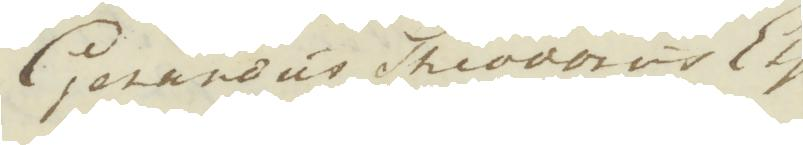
Gerardus Theodorus Es
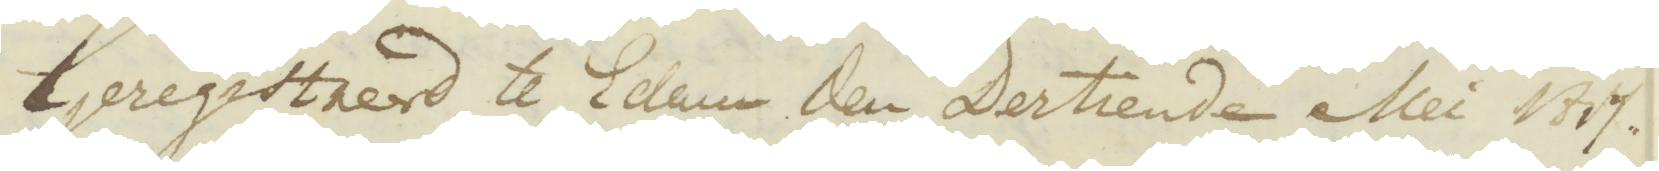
Geregistreerd te Edam den Dertiende Mei 1817.
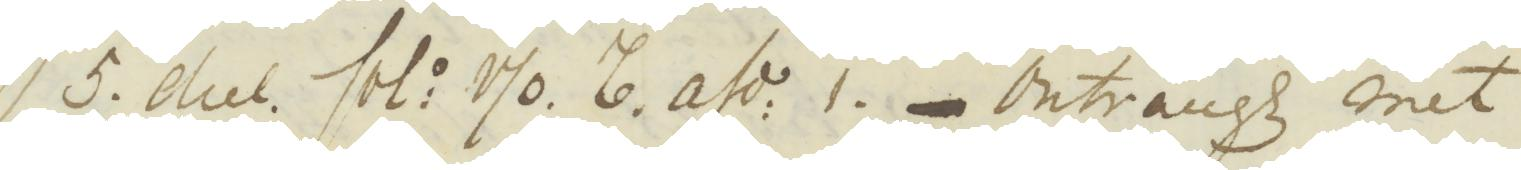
5. deel. fol:o 170. Re. afd: 1. — Ontvang met
